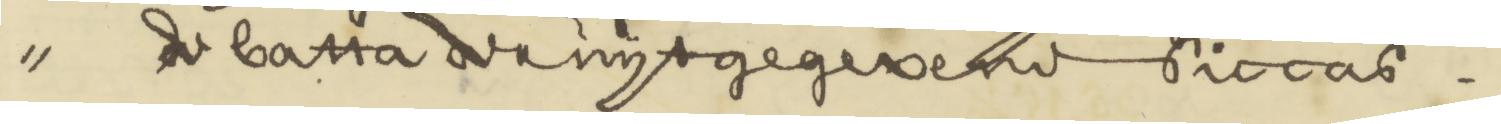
„ de batta der uijtgegevene siccas
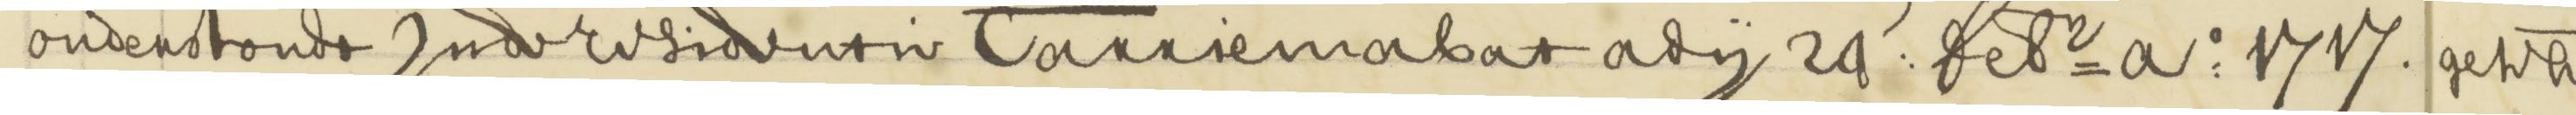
onderstondt Jn de residentie Carriemabat adij 24:' feb=ij a=o 1717. getek
